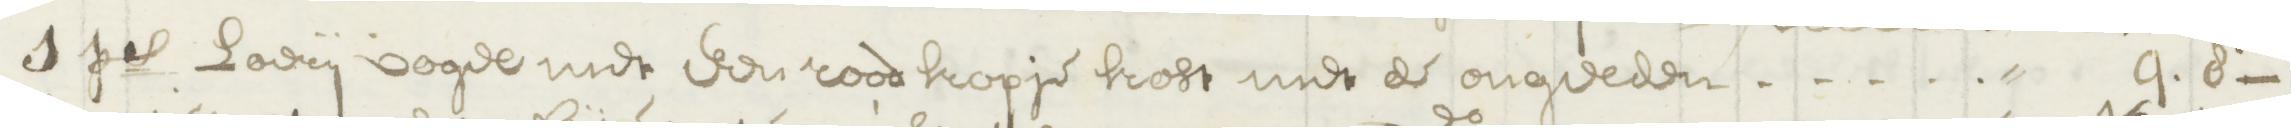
1 p=s Loerij vogel met Een rood kopje kost met de ongelden - - - - „ 4. 8 —
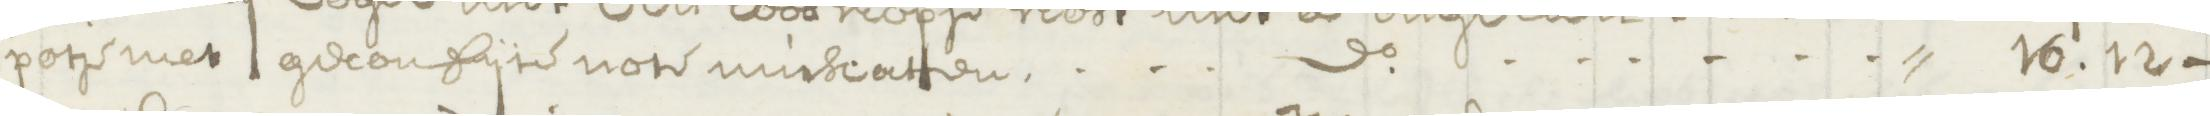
potje met geconfijte note muscaten, - - - D.o - - - - - - „ 16. 12 —
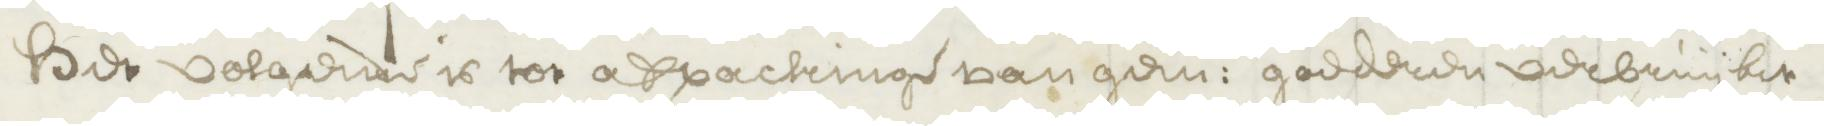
het volgende is tot afpackinge van gem: goederen verbruijkt
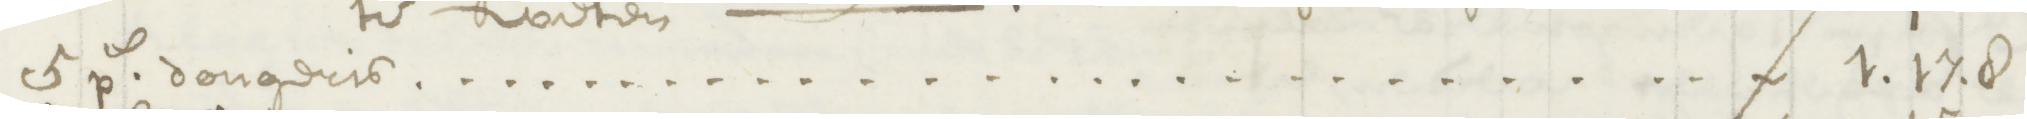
5 p.s dongeris - - - - - - - - - - - - - - - - - - - - - - - - - ƒ 1. 17.8
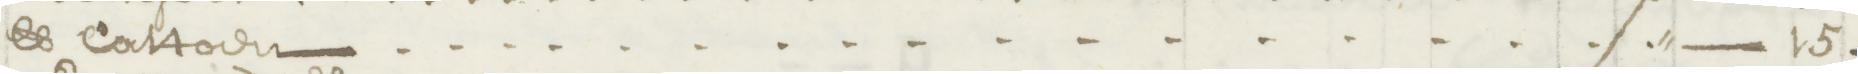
lb Cattoen - - - - - - - - - - - - - - - „ — 15
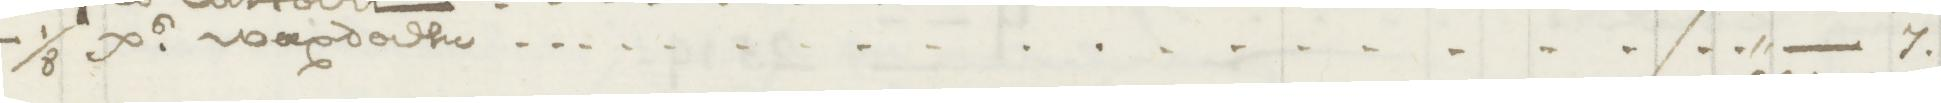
-1/8 p:s waxdoek - - - - - - - - - - - - - - - - - - - „— 7.
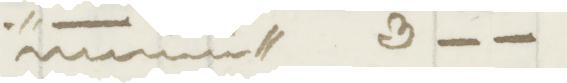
— „ 3 — —
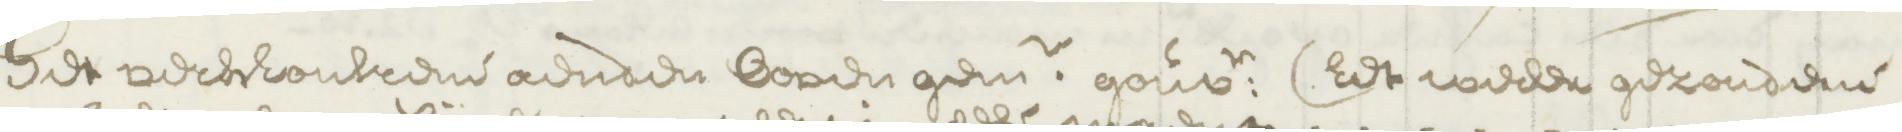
het verschonkene aenden boven gem: gouv: (het weder gezondene
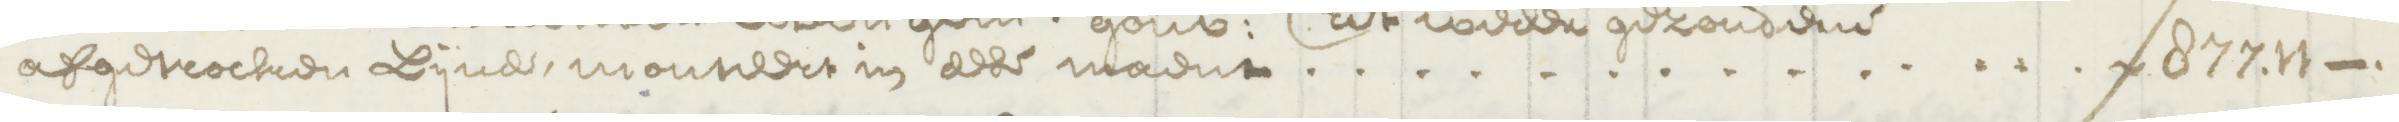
afgetrocken zijnde, monteert in dese maent - - - - - - - - - - - - ƒ 877.11.—.
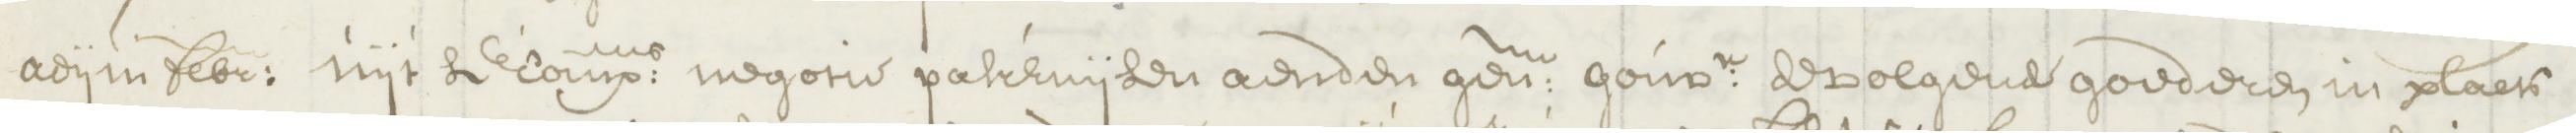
adij in febr: uijt 's E Comp:s negotie pakhuijsen aenden gen: gouv:r de volgende goederen in plaets
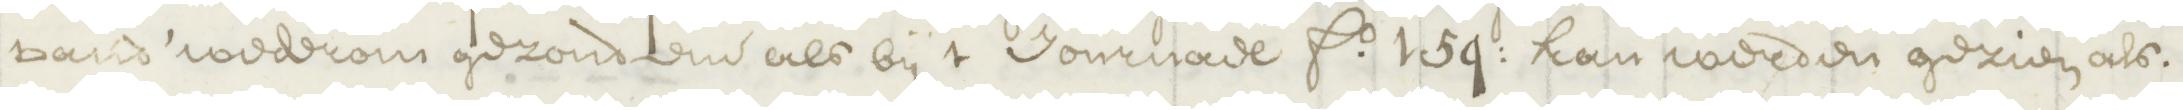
vand' wederom gezondene als bij ’t Iournael f.o 154: kan werden gezien als.
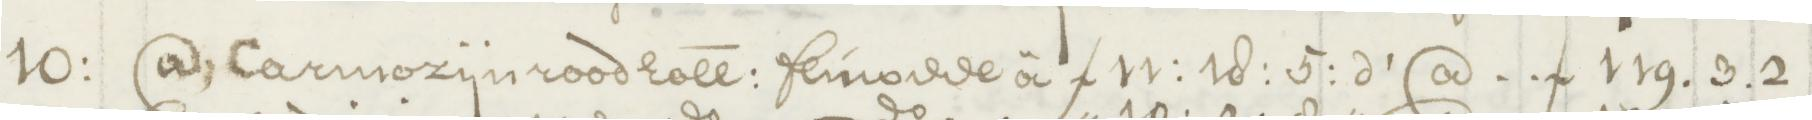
10: @: Carmozijn rood holl: fluweel â ƒ 11: 18: 5: d' @ . . f 119. 3. 2
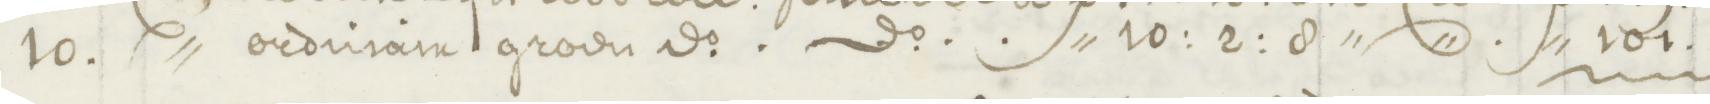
10. „ ordinair groen d.o . do . . „ 10: 2: 8 „ „ . „ 101.
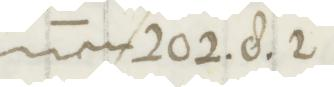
— ƒ 202.8. 2
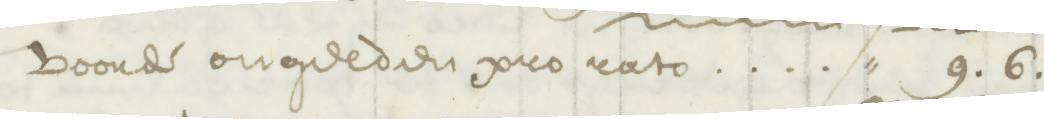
voor de ongelden pro rato . . . . „ 9. 6.
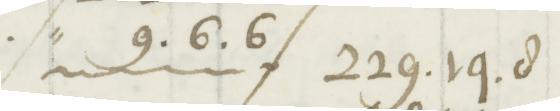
„ 9. 6. 6 ƒ 229. 14. 8
